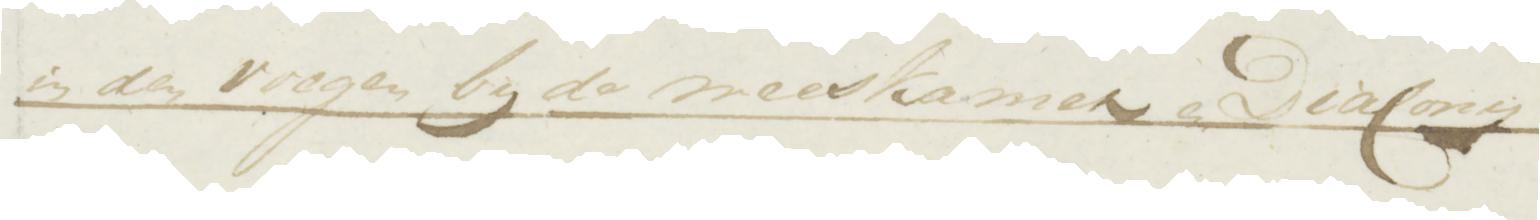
in den voegen bij de weeskamer en Diaconij
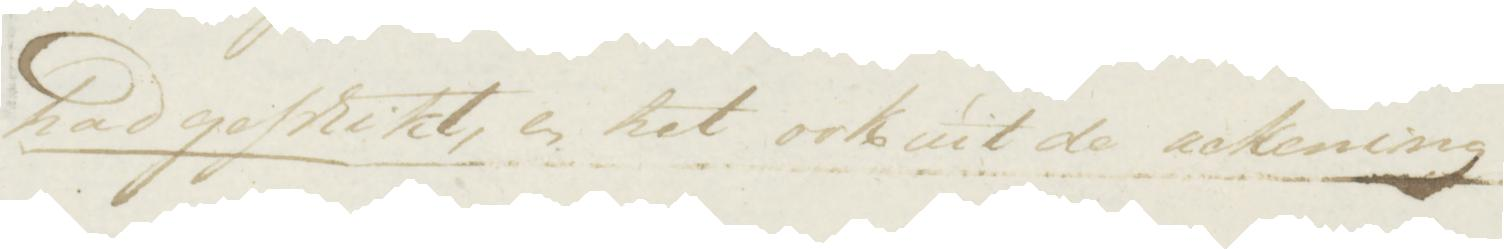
had geschikt, en het ook uit de rekening
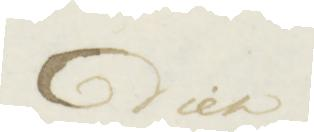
dier
